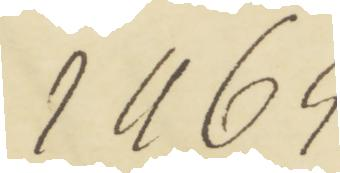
1465
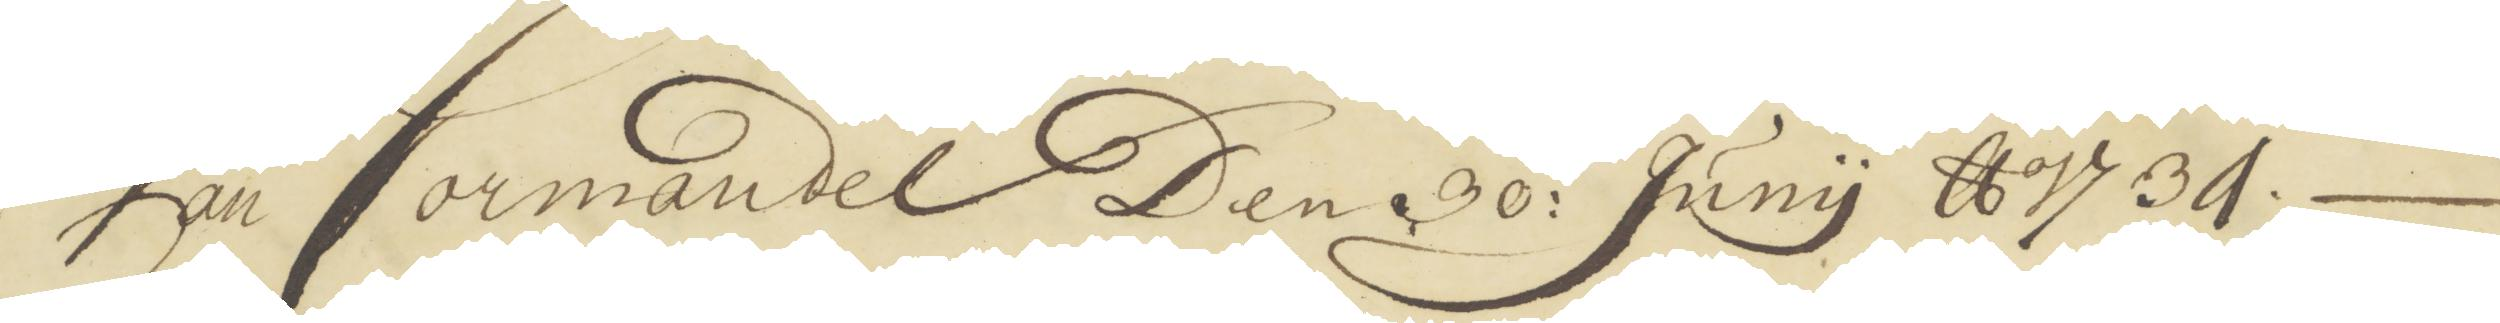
Van Cormandel Den 30:' Junij Ao 1734.—
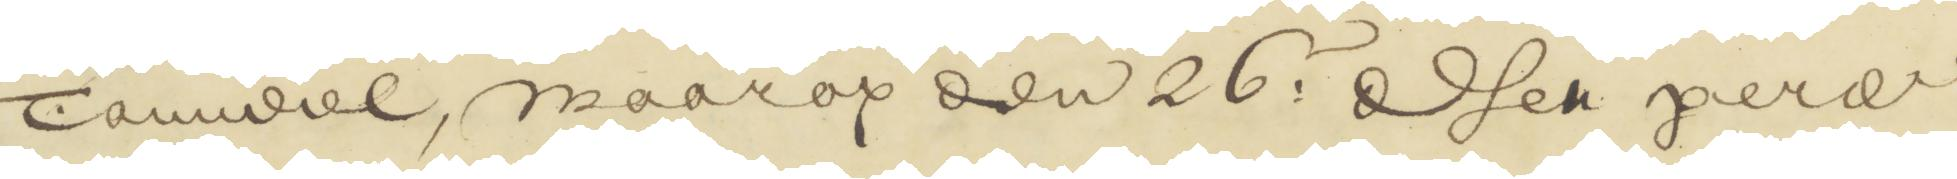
Canneel, waarop den 26:' deser per de
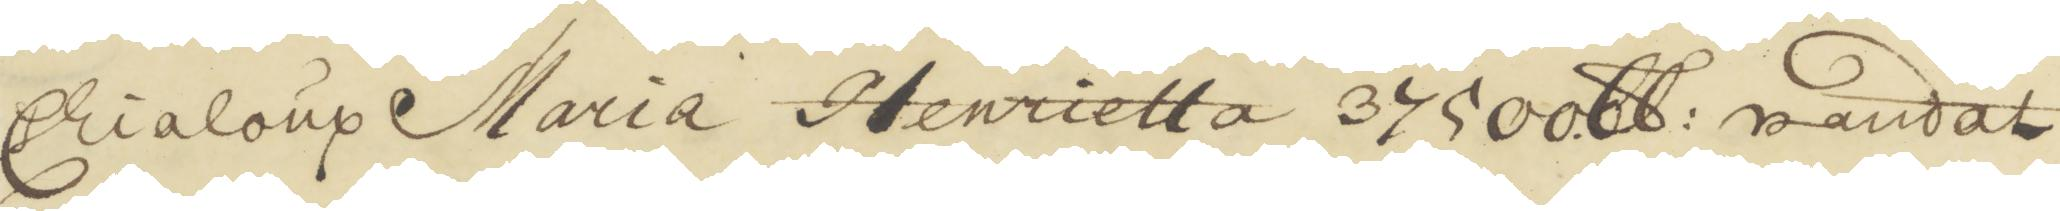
Chialoup Maria Henrietta 37500 lb: vandat
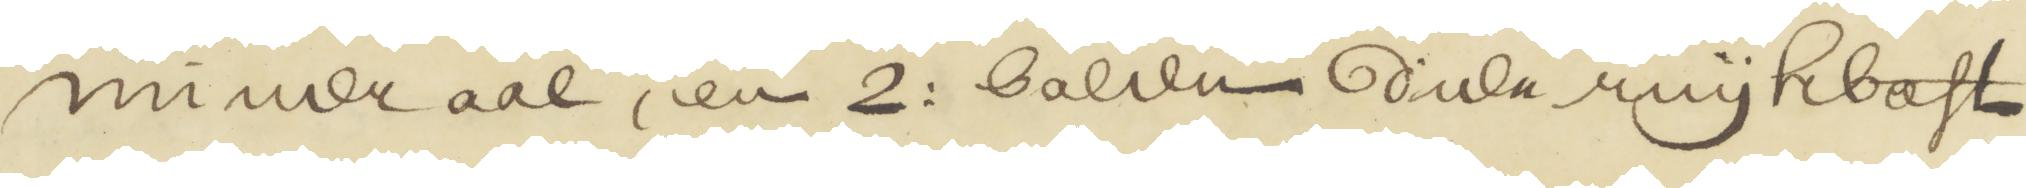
mineraal en 2: balen dier ruijkbast
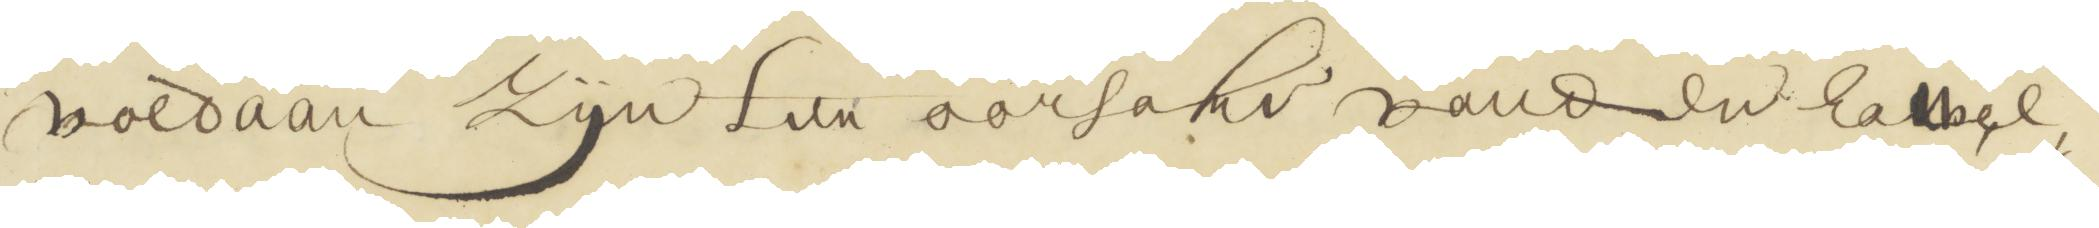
voldaan zijn ter oorsake van den hawel„
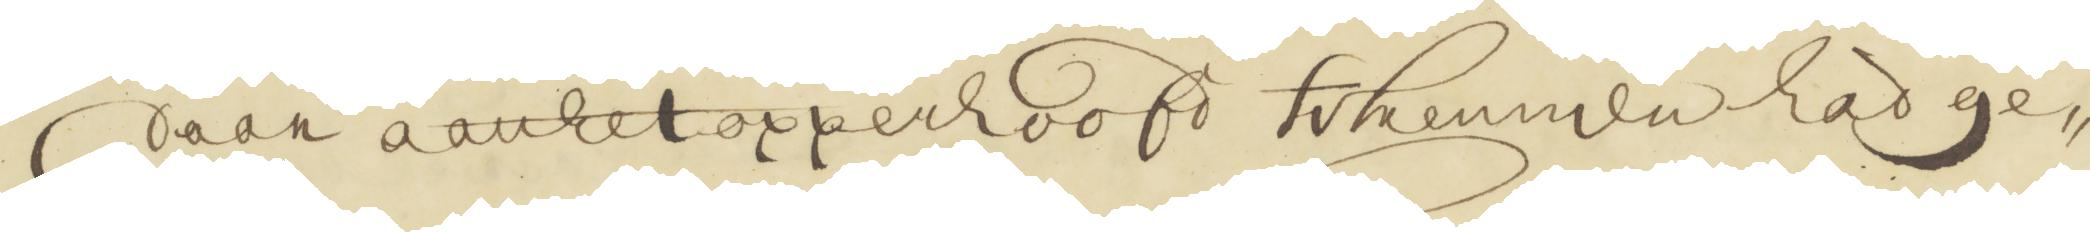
daar aan het opperhoofd te kennen had ge„
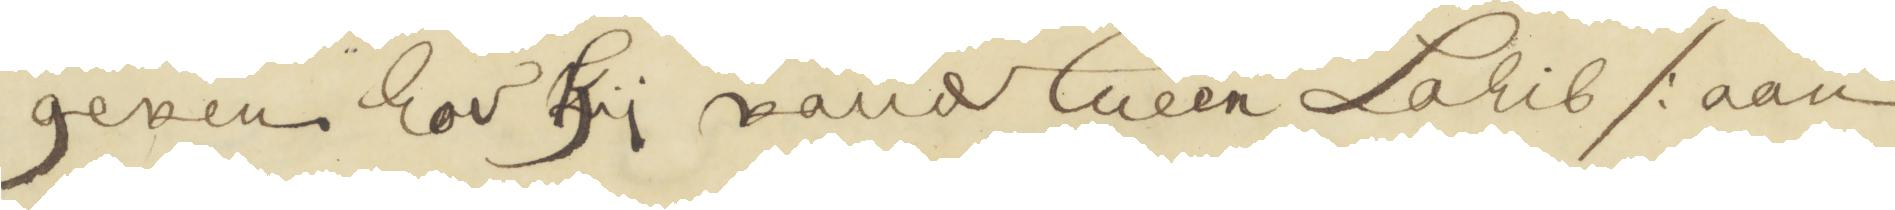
geven hoe hij van de heer Lahib /:aan
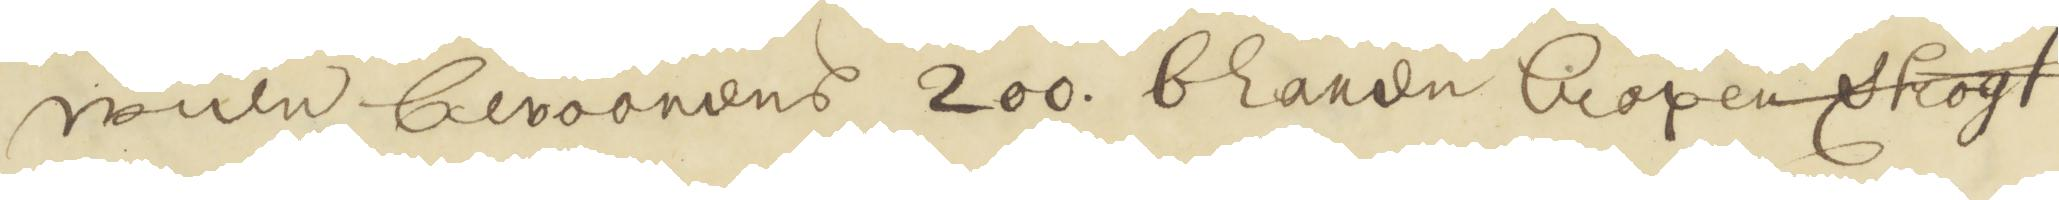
wier bevoorens 200. bharen koper verkogt
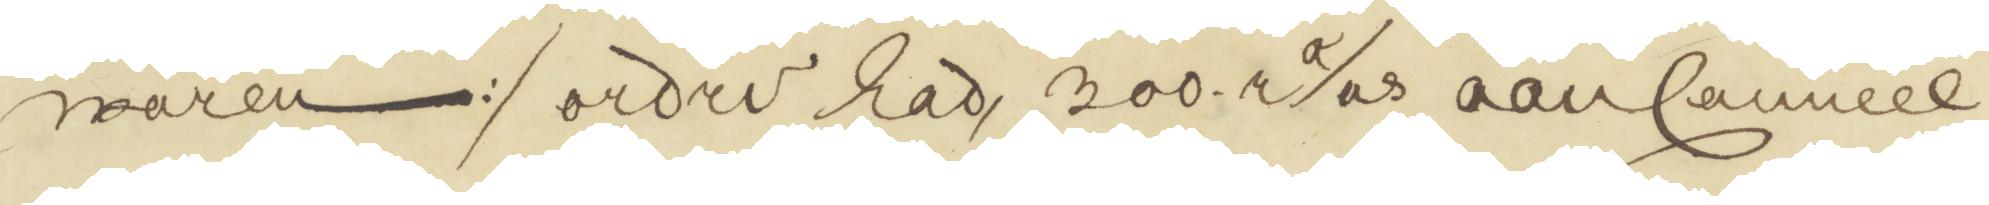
waren:/ ordre had, 300-r a/as aan Canneel
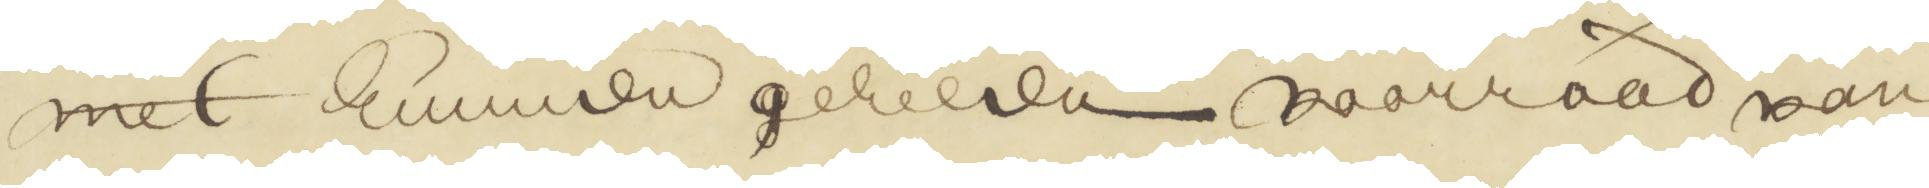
met hunnen gehelen voorraad van
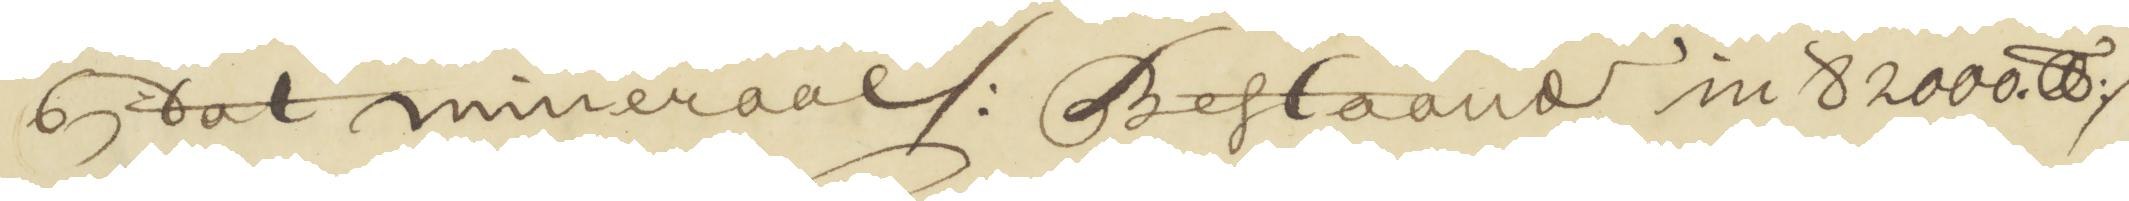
dat mineraal /:Bestaande in 82000. lb:/
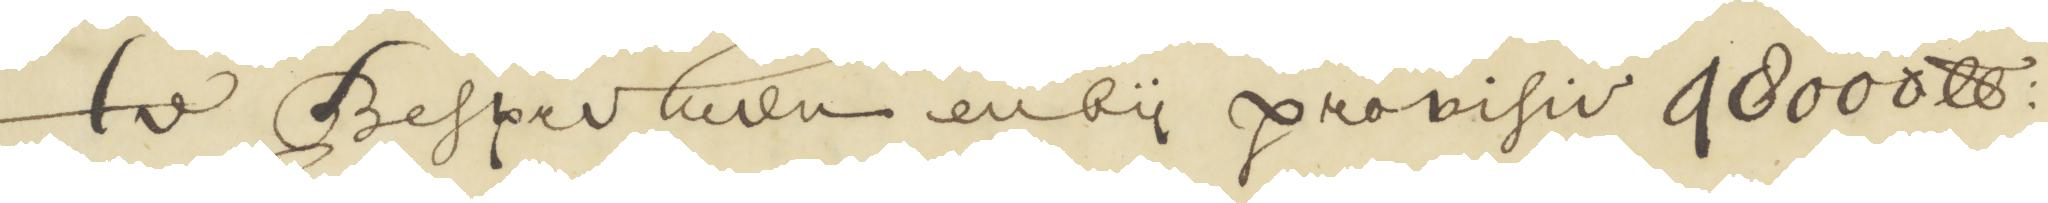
te Bespreken en bij provisie 48000 lb:
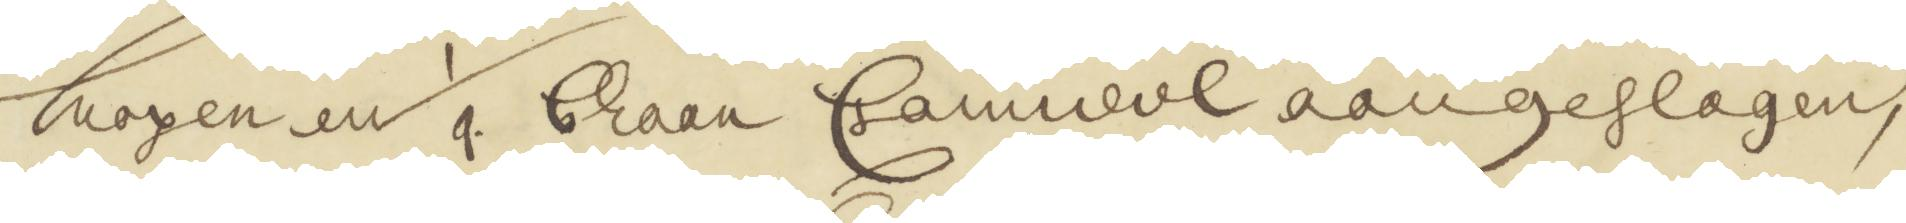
kopen en ¼ bhaar Canneel aangeslagen,
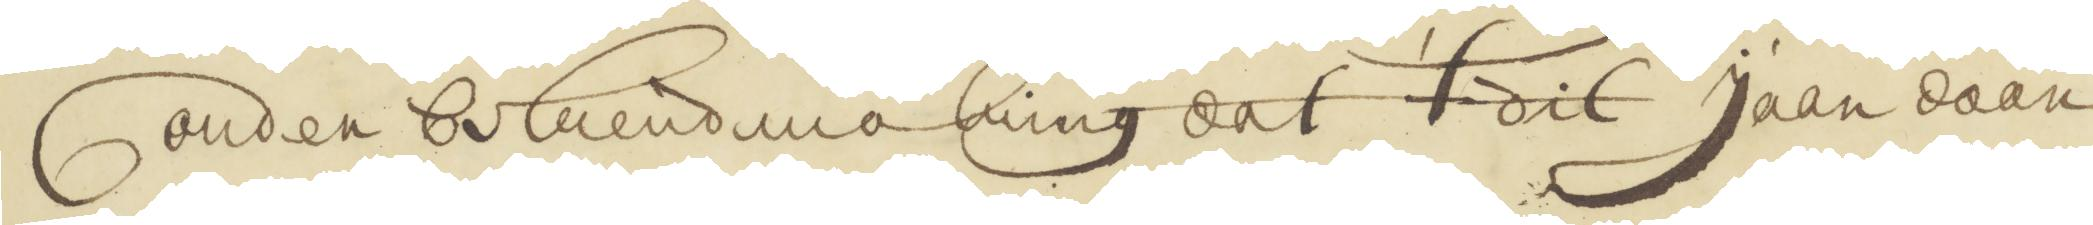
onder bekendmaking dat 't dit jaar daar
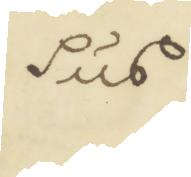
sub
